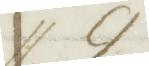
„ 9
